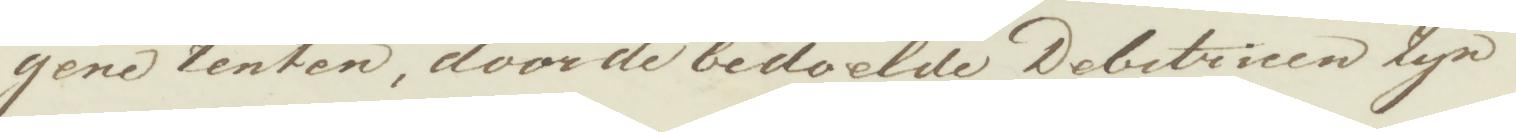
gene renten, door de bedoelde Debitricen zyn
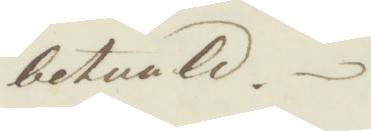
betaald. —
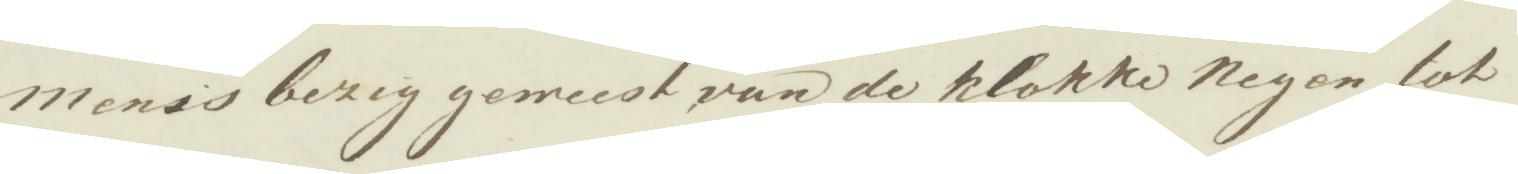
men is bezig geweest van de klokke negen, tot
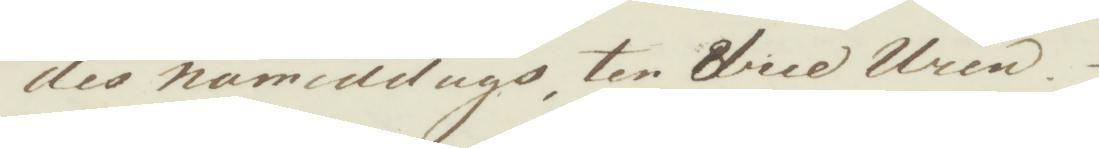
des namiddags, ter drie Uren.
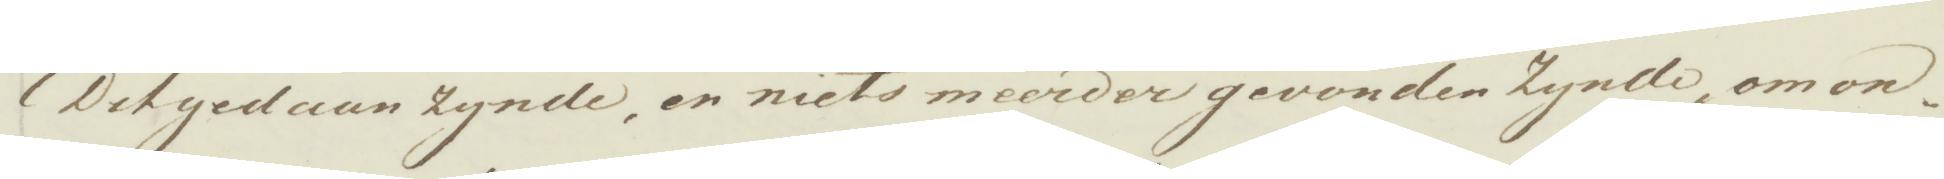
Dit gedaan zynde, en niets meerder gevonden zynde, om on„
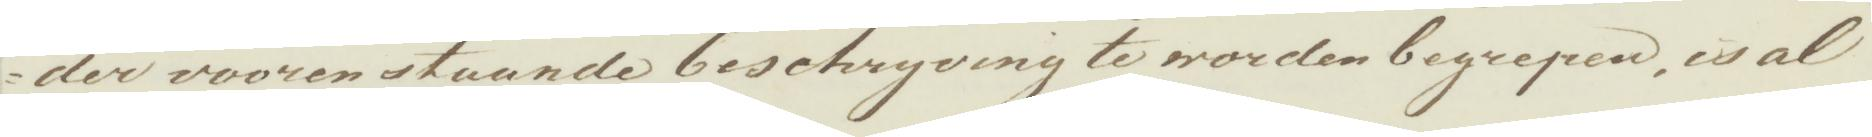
=der voorenstaande beschryving te worden begrepen, is al
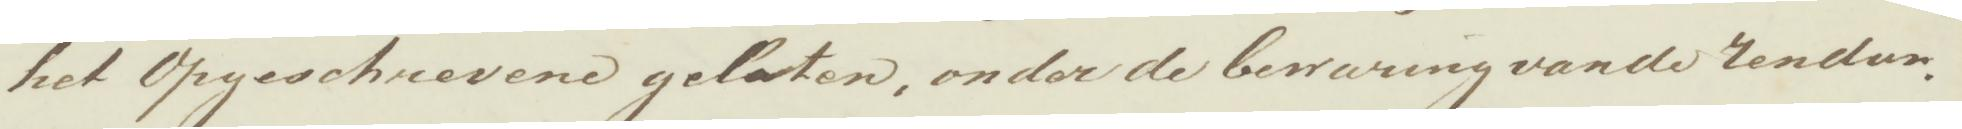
het opgeschrevene gelaten, onder de bewaring van de rendan„
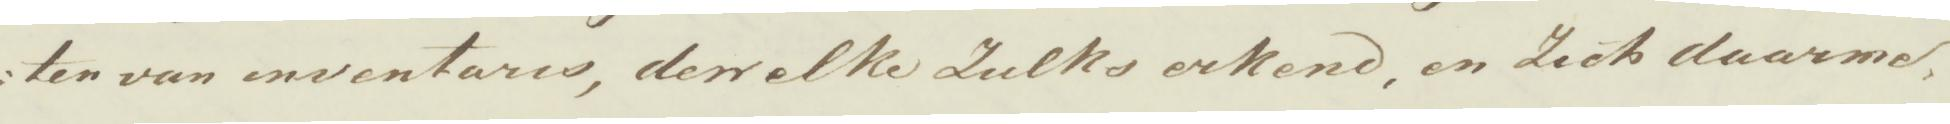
ten van inventaris, dewelke zulks erkend, en zich daarme„
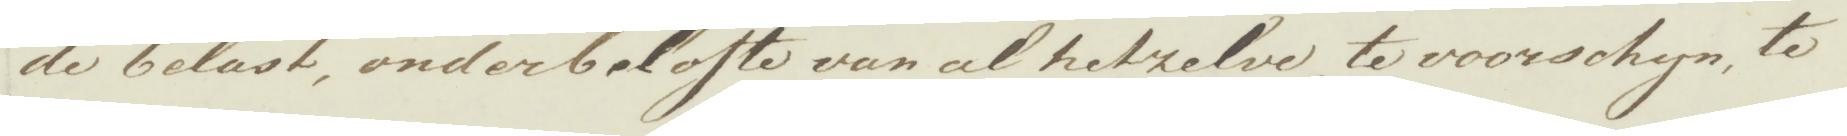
de belast, onderbelofte van al hetzelve, te voorschyn, te
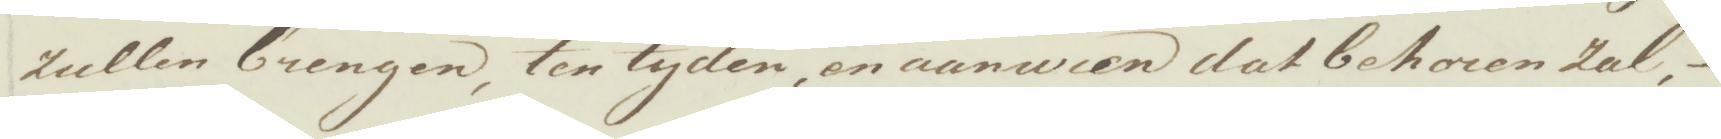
zullen brengen, ten tyden, en aanwien dat behoren zal, —
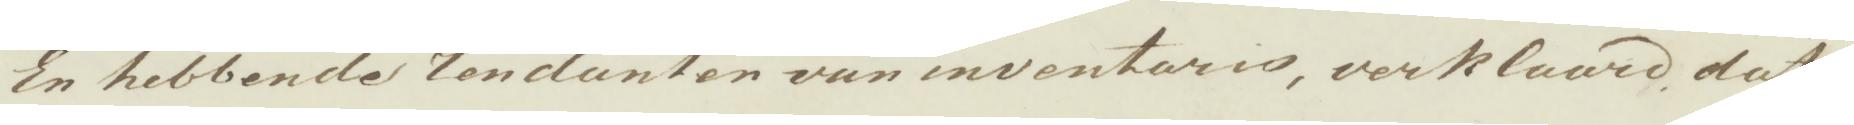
En hebbende rendanten van inventaris, verklaard, dat
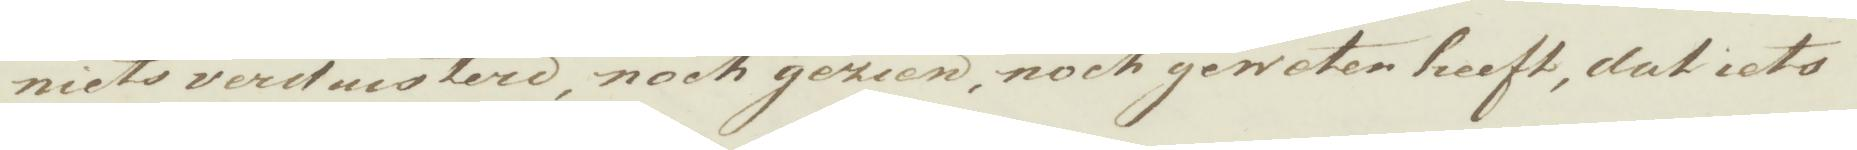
niets verduisterd, noch gezien, noch geweten heeft, dat iets
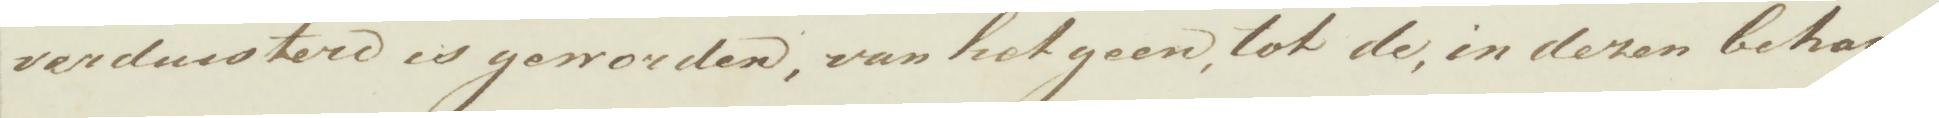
verduisterd is geworden, van het geen, tot de, in dezen behan-
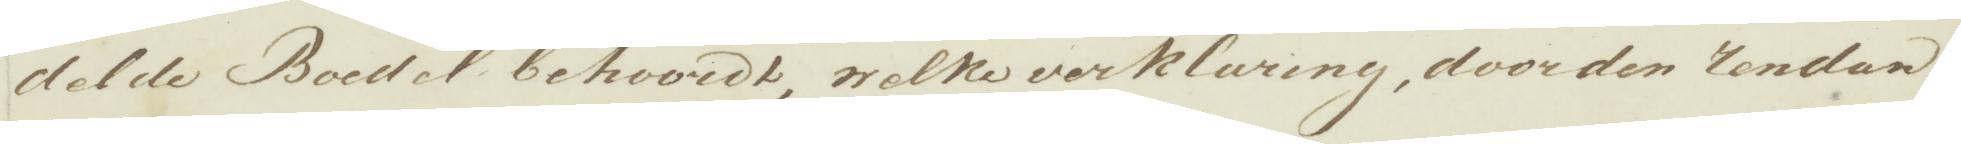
delde Boedel, behoordt, welke verklaring, door den rendan
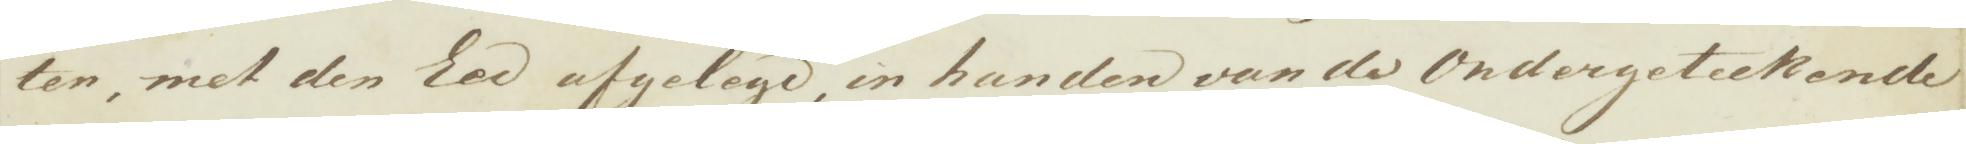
ten, met den Eed afgelegd, in handen van de Ondergeteekende
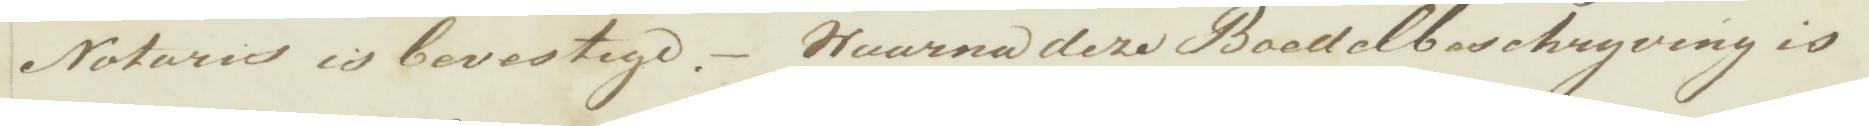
Notaris is bevestigd. – Waarna deze Boedelbeschryving is
